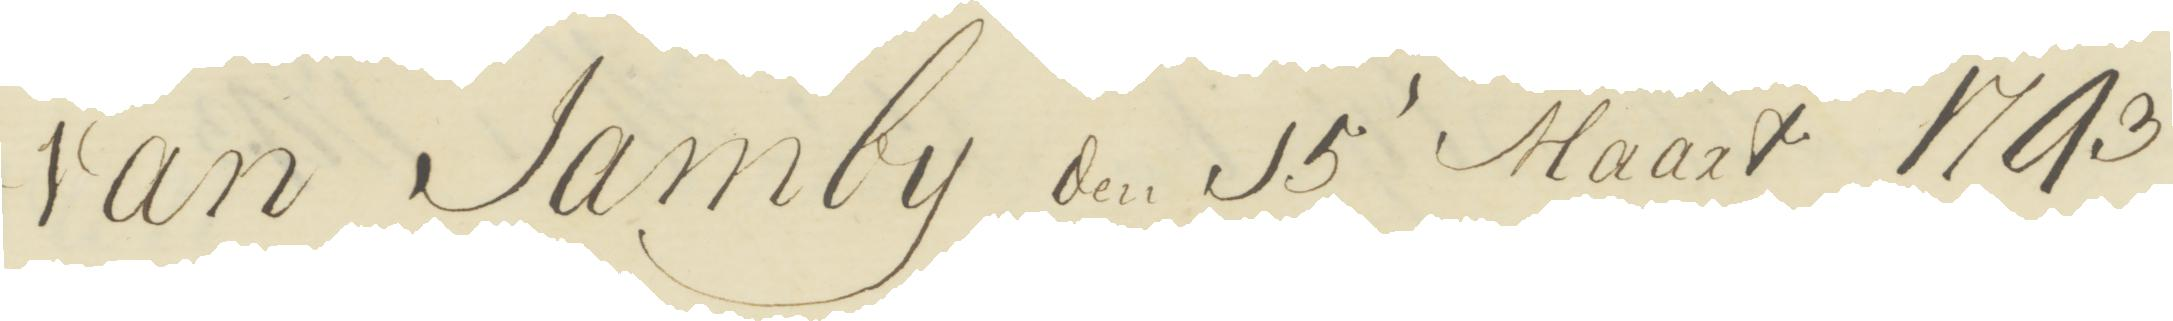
Van Jamby den 15' Maart 1743
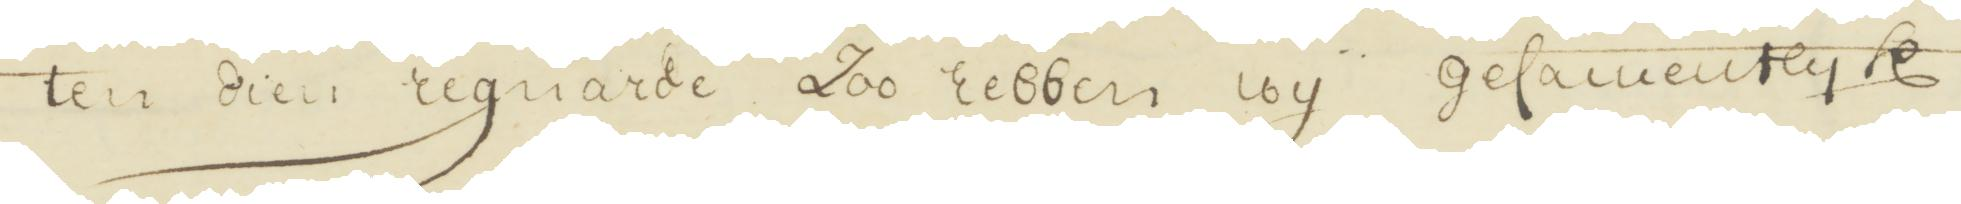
ten dien reguarde zoo hebben wij gesamentlyk
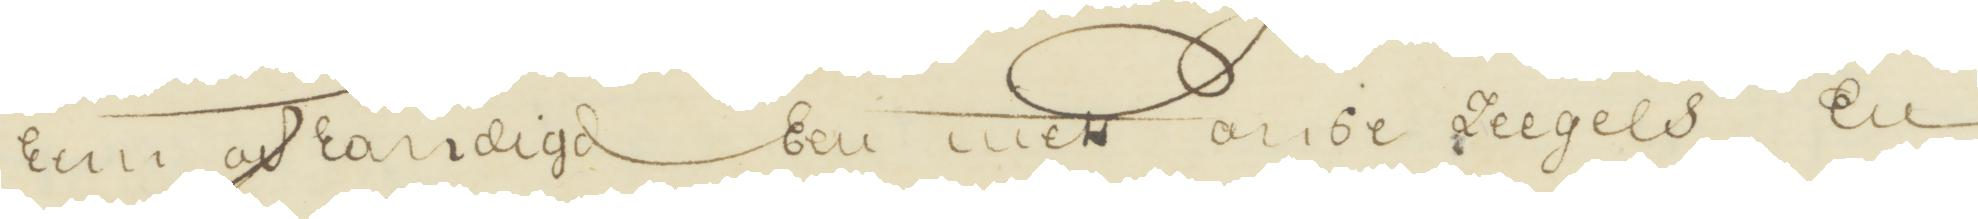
hun overhandigd een met onse zeegels en
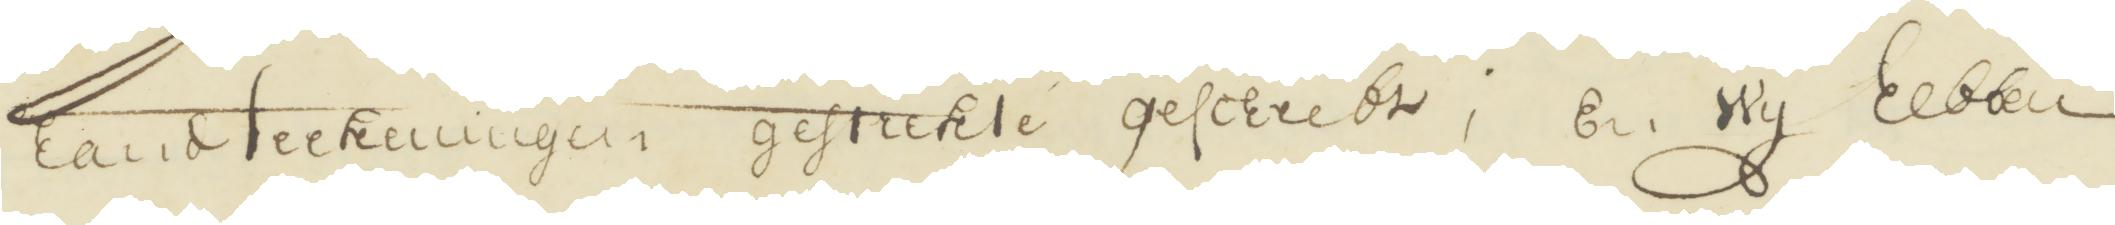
handteekeningen gestrekte geschrift; en wy hebben
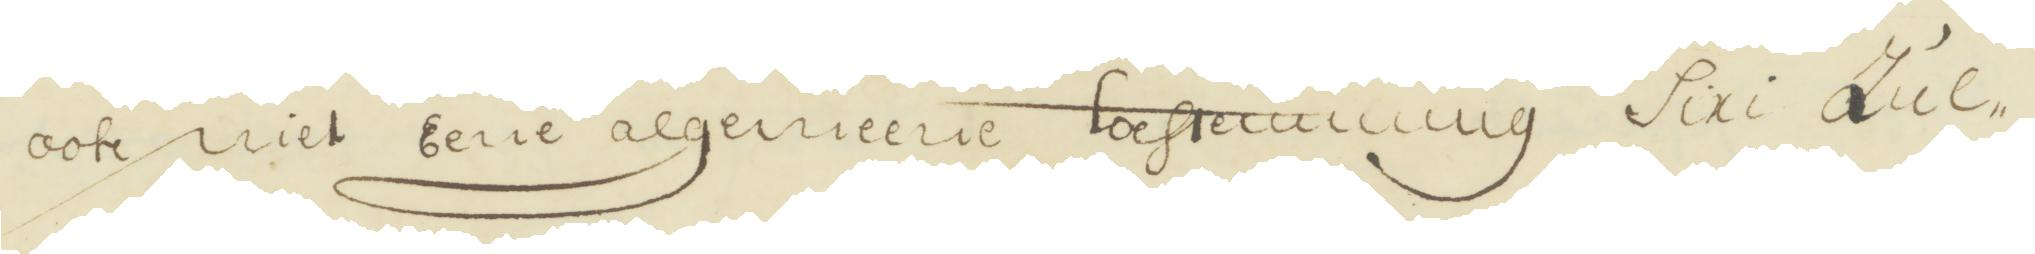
ook niet eene algemeene toestemming Sixi Zul„
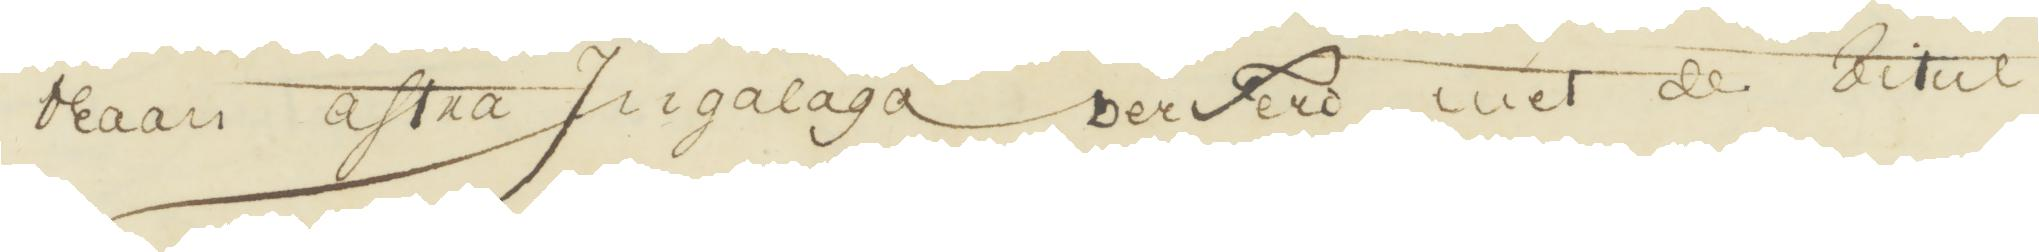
thaan astra Ingalaga ver eerd met de titul
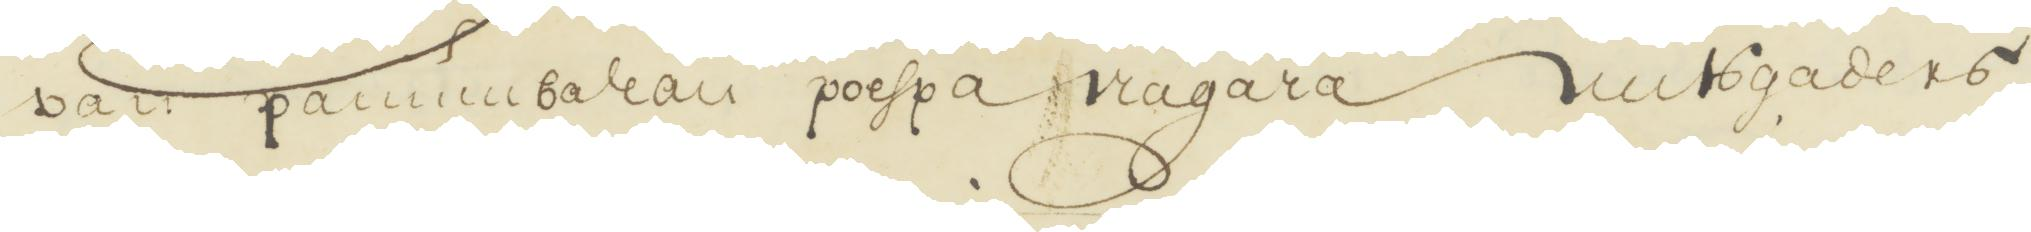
van pamunbahan poespa nagara mitsgaders
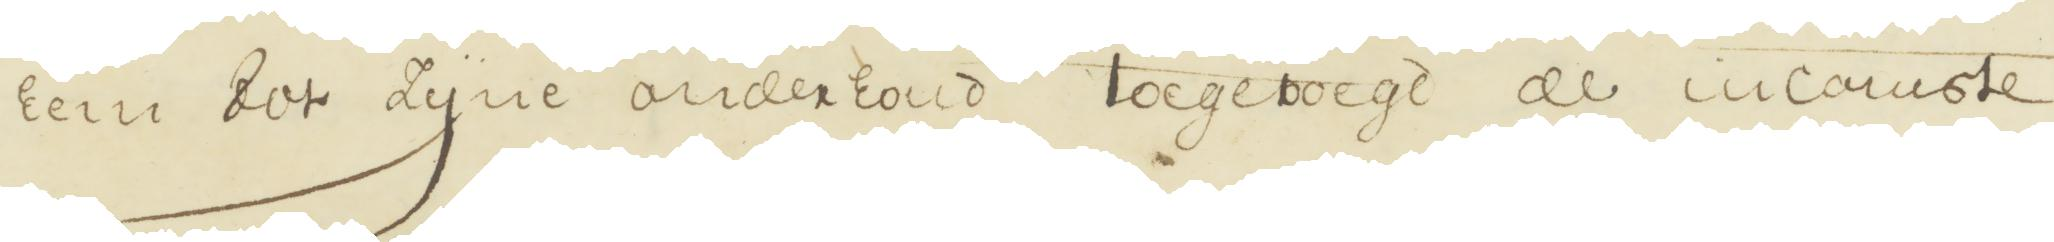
hem tot zijne onderhoud toegevoegd de incomste
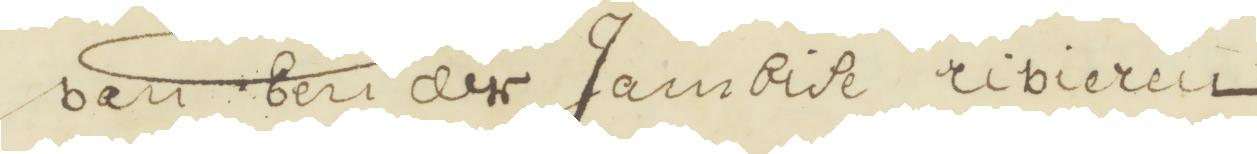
van hen der Jambise rivieren
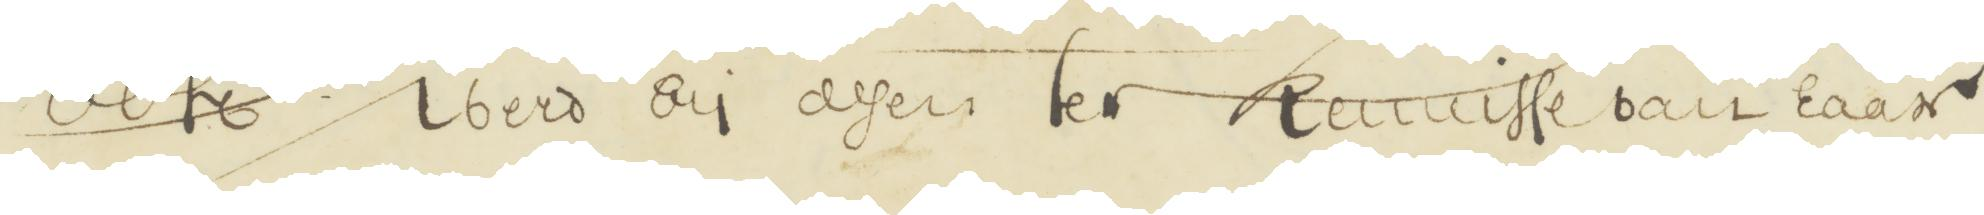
Ook werd bij desen ter Kennisse van haar
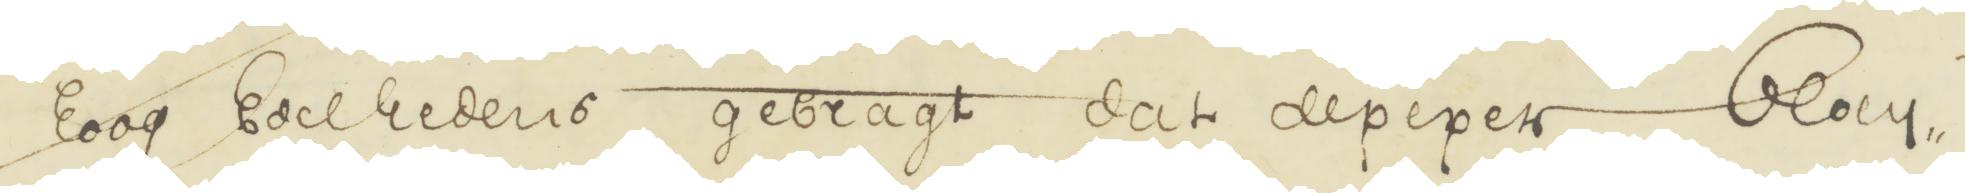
hoog Edelhedens gebragt dat de peper bloey„
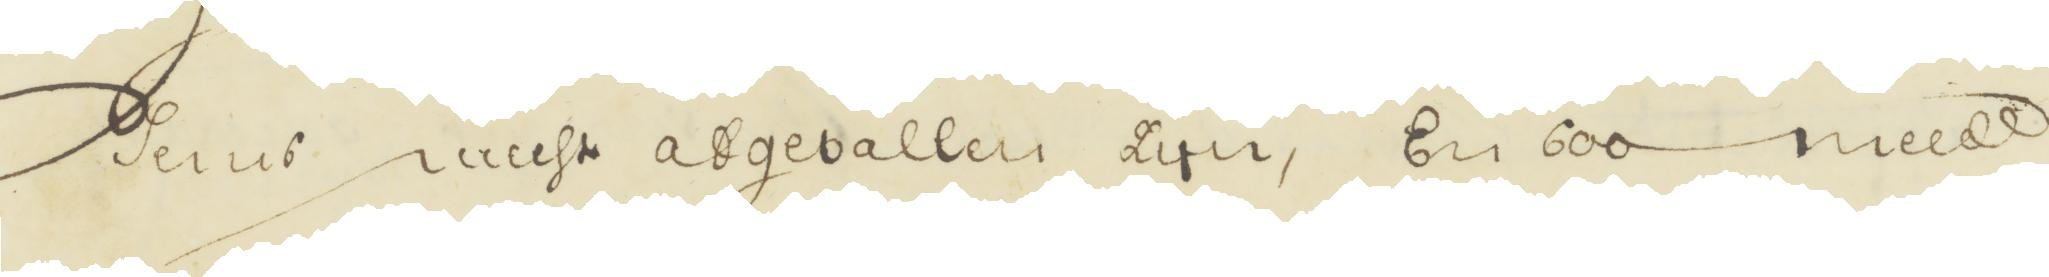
sems meest afgevallen zyn, en soo meede
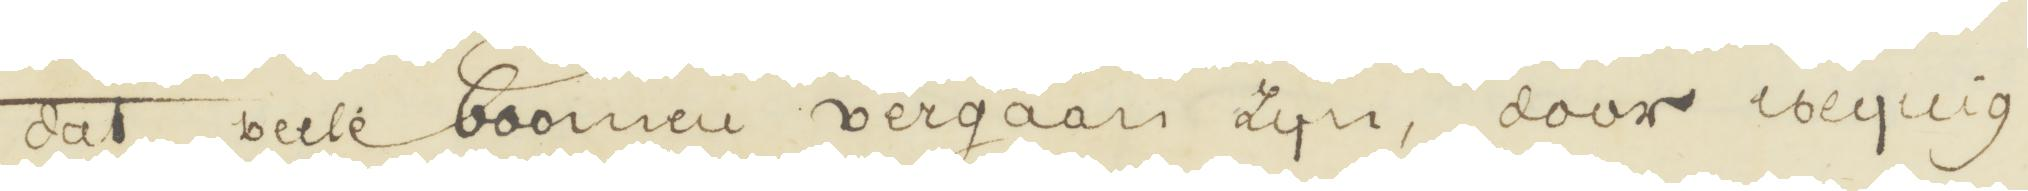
dat veele boomen vergaan zyn, door weynig
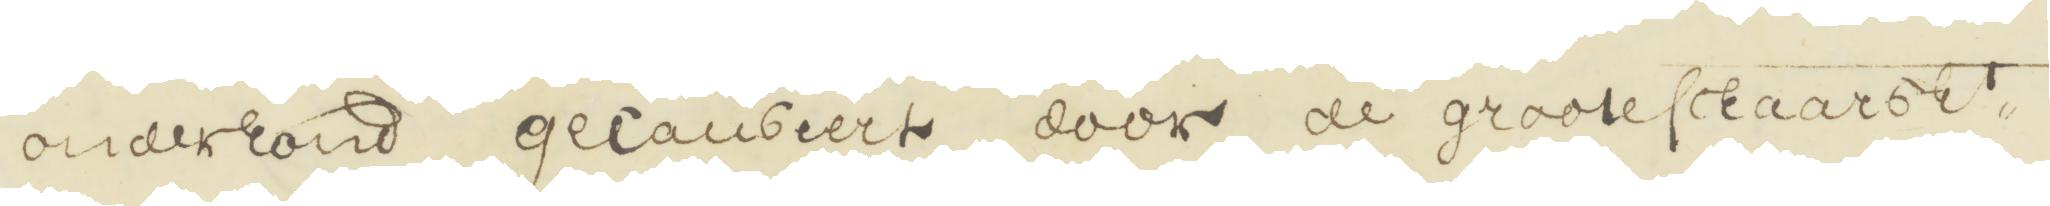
onderhoud gecauseert door de groote schaarsh„t
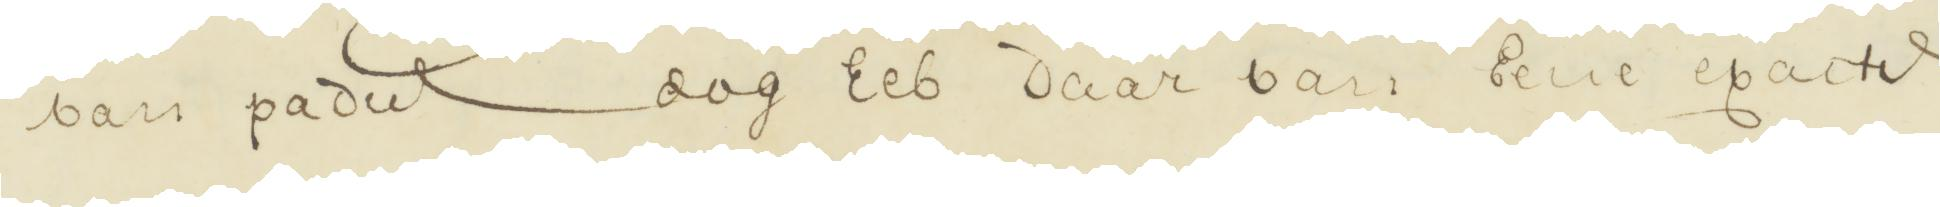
van padie dog heb daar van eene exacte
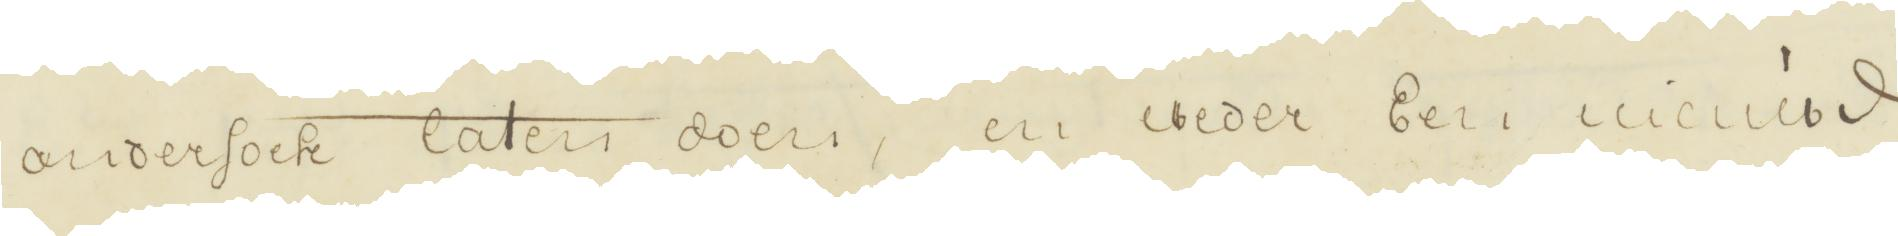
ondersoek taten doen, en weder hen nieuwe
